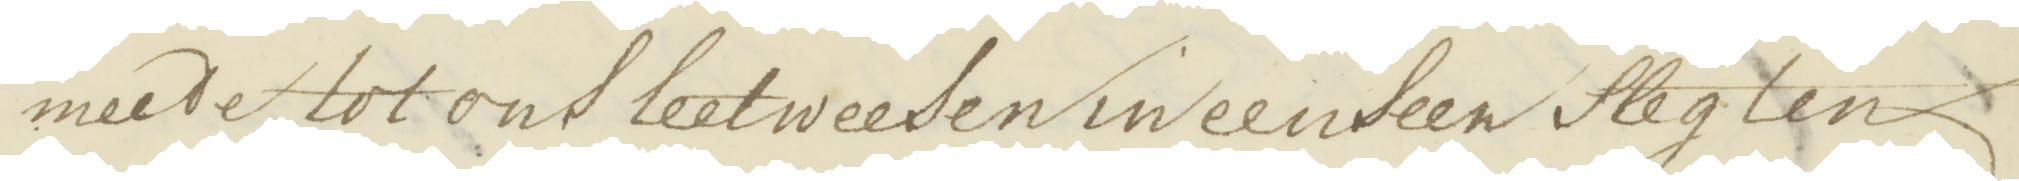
meede tot ons leetweesen in een seer slegten
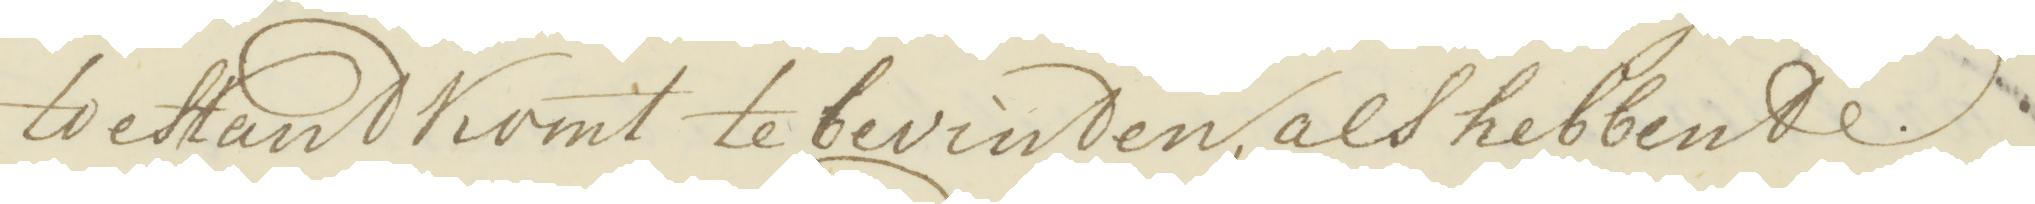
toestand komt te bevinden, als hebbende
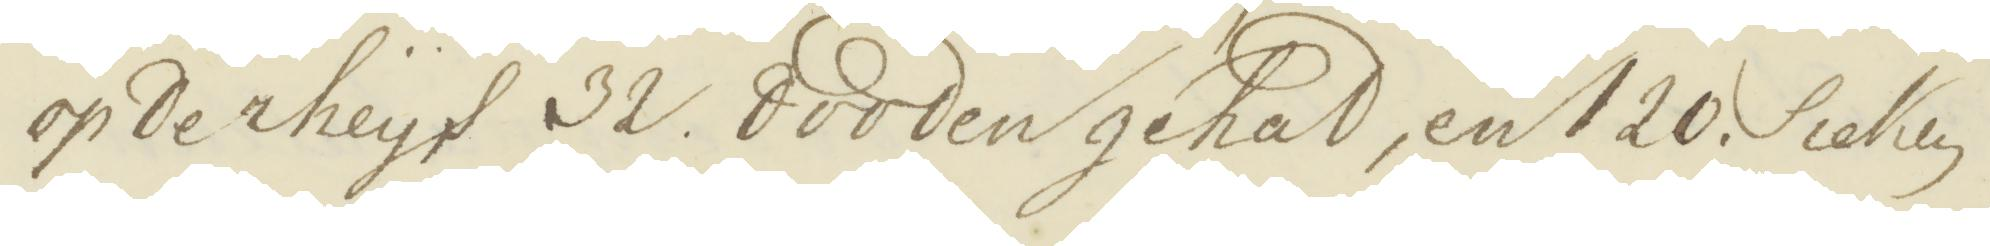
op de rheijs 32 dooden gehad, en 120 sieken
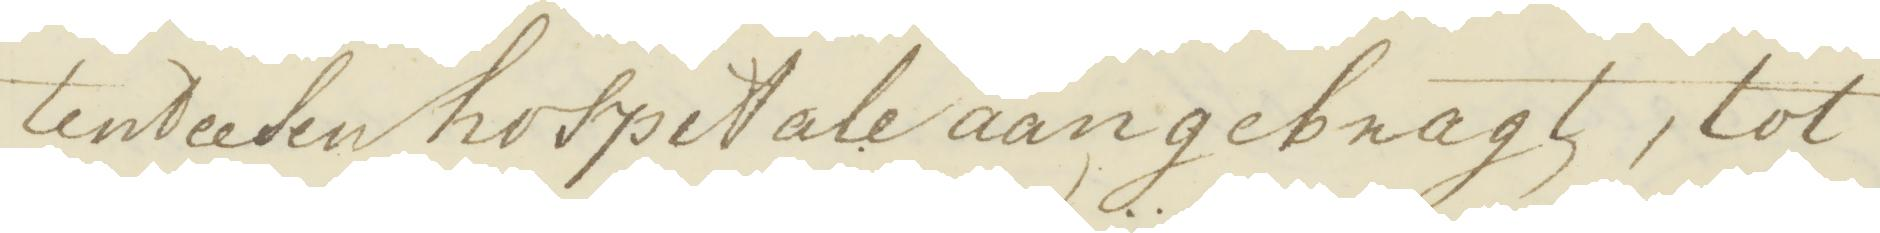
ten deesen hospitale aangebragt, tot
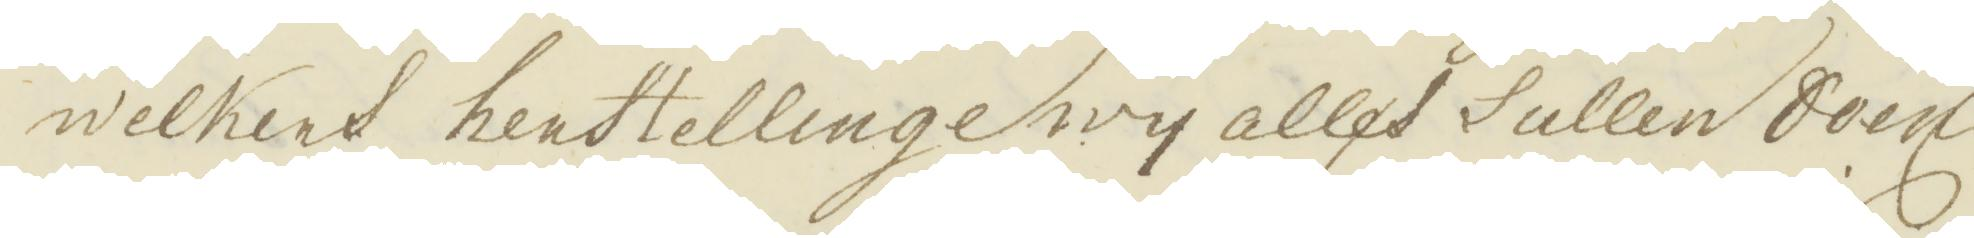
welkers herstellinge wij alles sullen doen
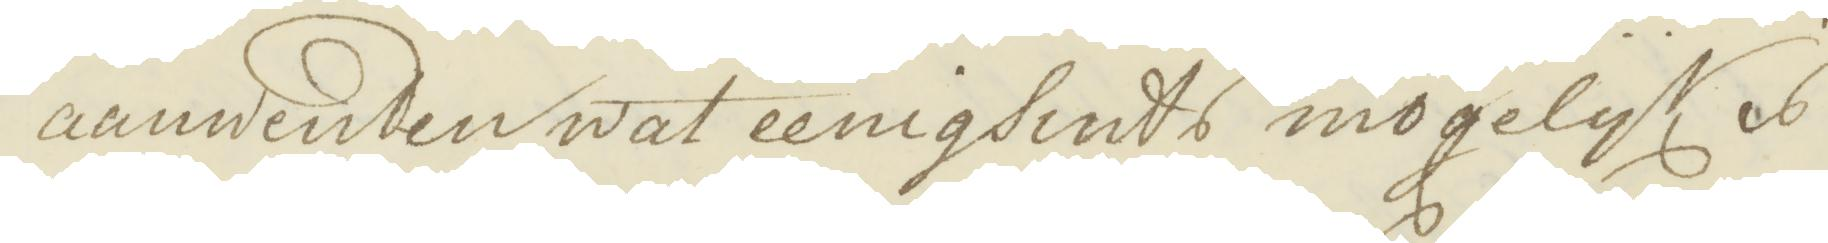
aanwenden wat eenigsints mogelijk is,
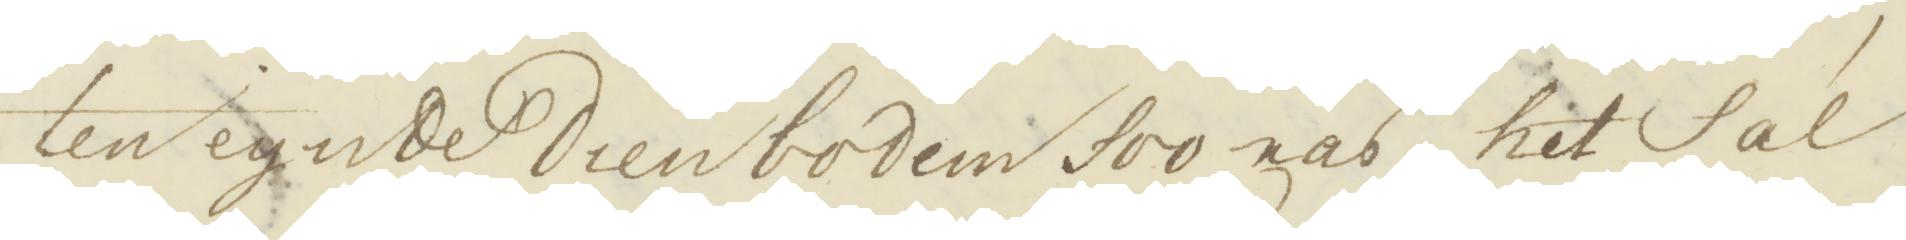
ten eijnde dien bodem soo ras het sal
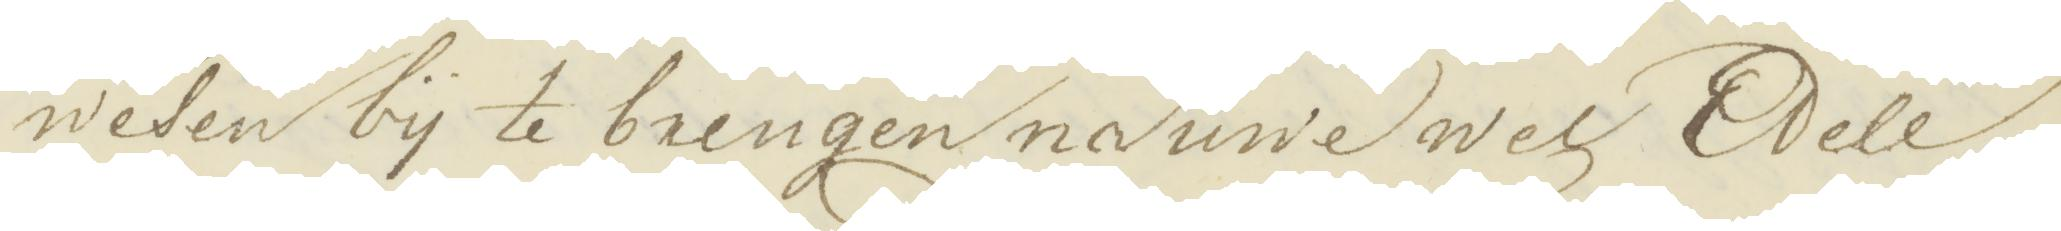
wesen bij te brengen na uwe wel Edele
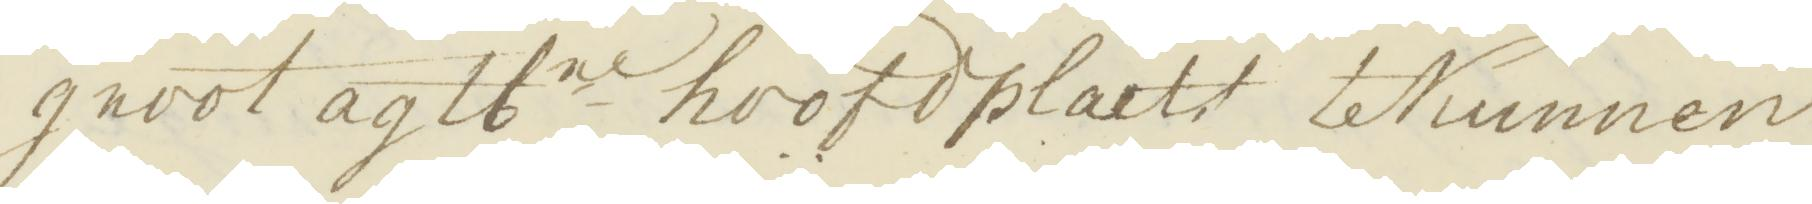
groot agtb=re hoofdplaets te kunnen
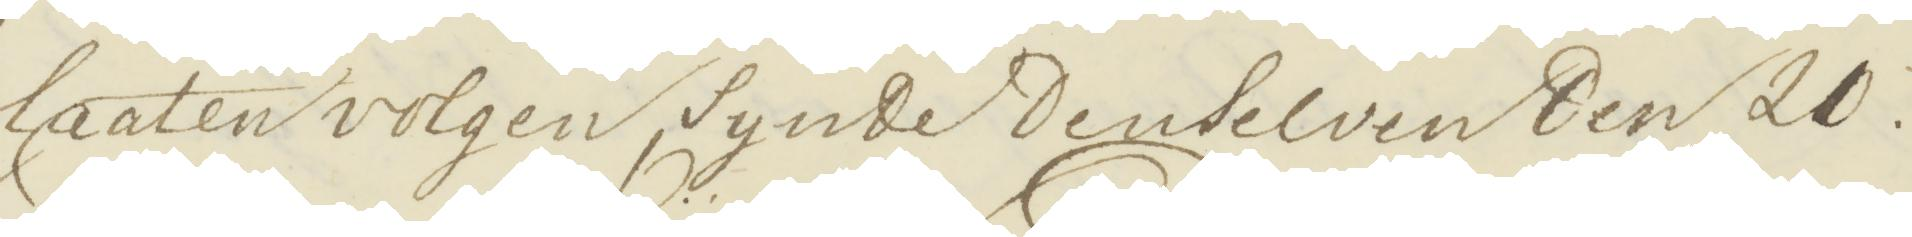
laaten volgen, sijnde denselven den 20:'
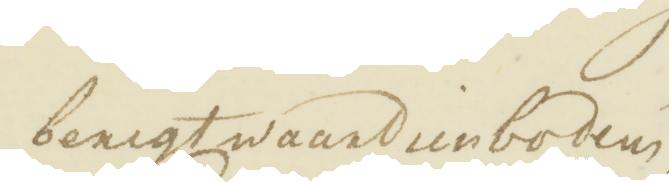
berigt waar dien bodem
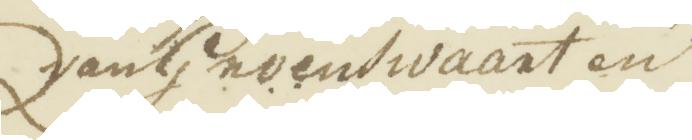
van Groenswaart en
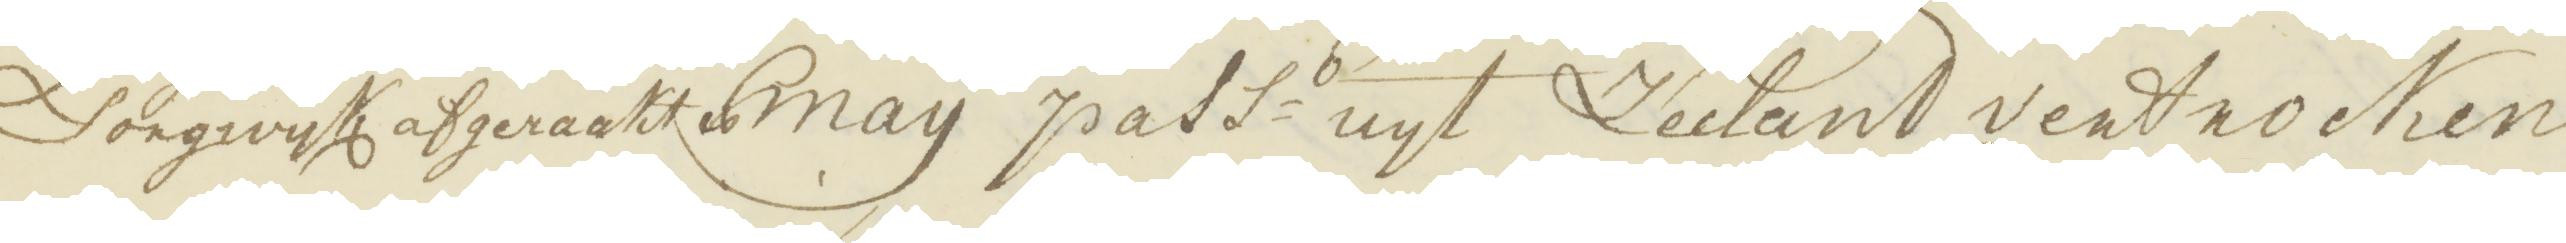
Sorgwijk afgeraakt is maij pass:o uijt Zeeland vertrocken
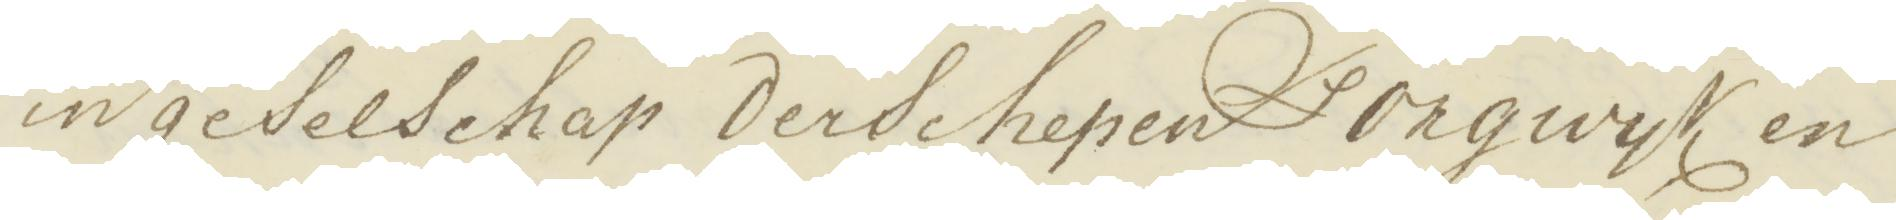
in geselschap der schepen Sorgwijk en
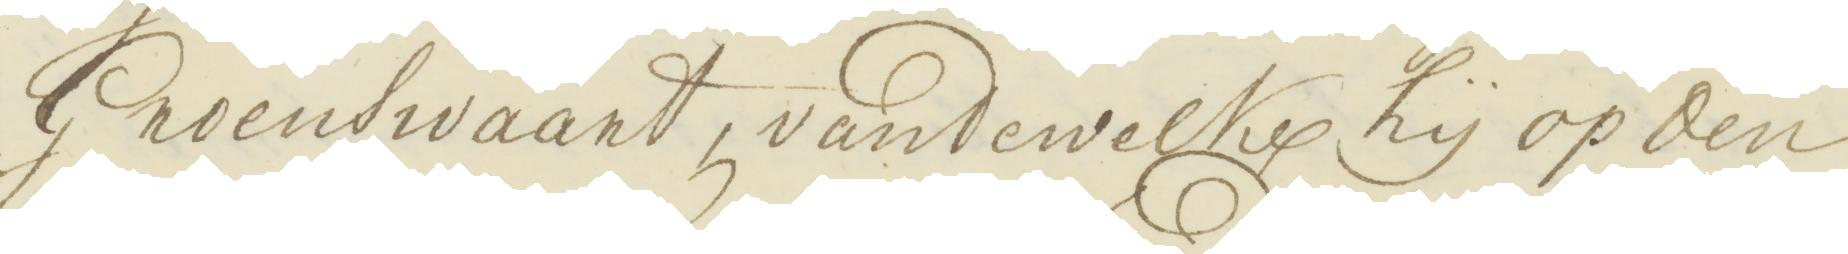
Groenswaart, van dewelke hij op den
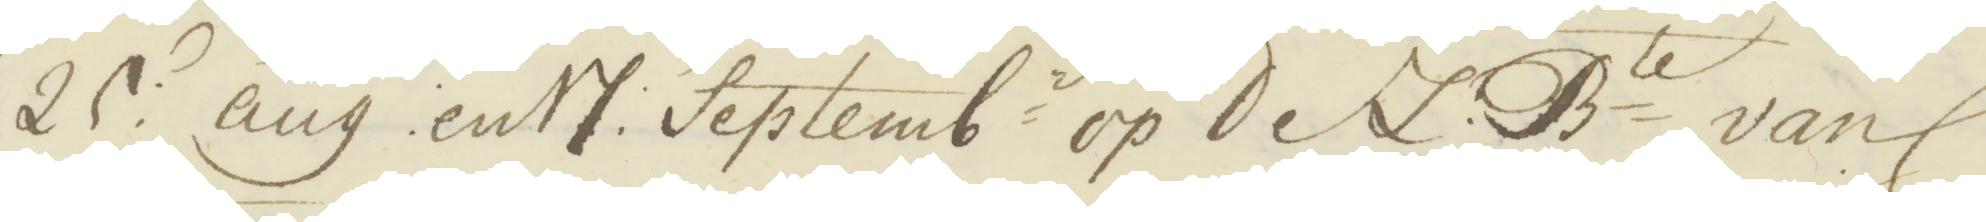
25:' aug: en 17:' Septemb=r op de Z.B:te van
